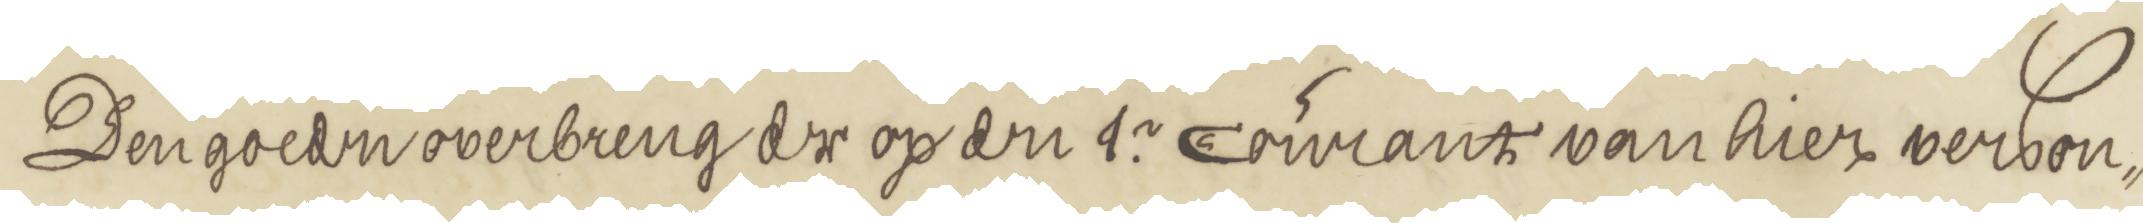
Den goeden overbreng der op den 1.' courant van hier verson,
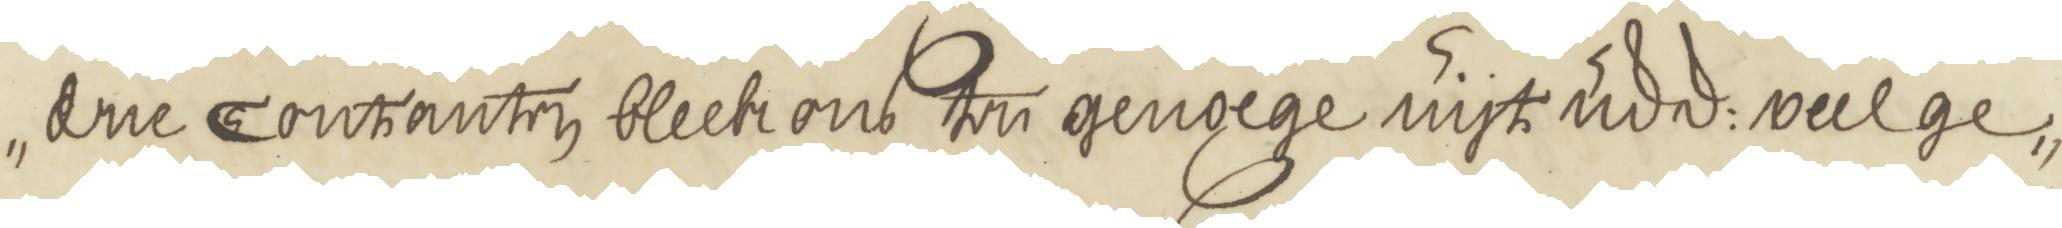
,dene contanten bleek ons ten genoege uijt uEd: veelge,
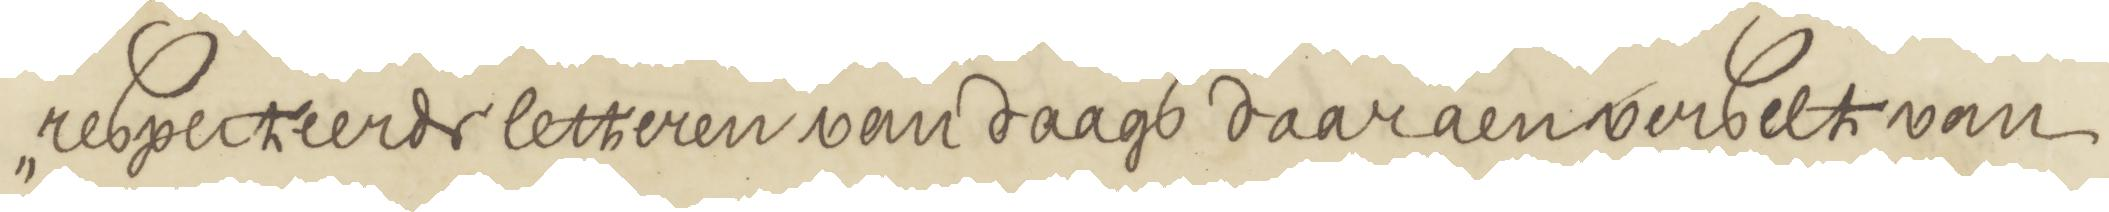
„respecteerde letteren van daags daaraen verselt van
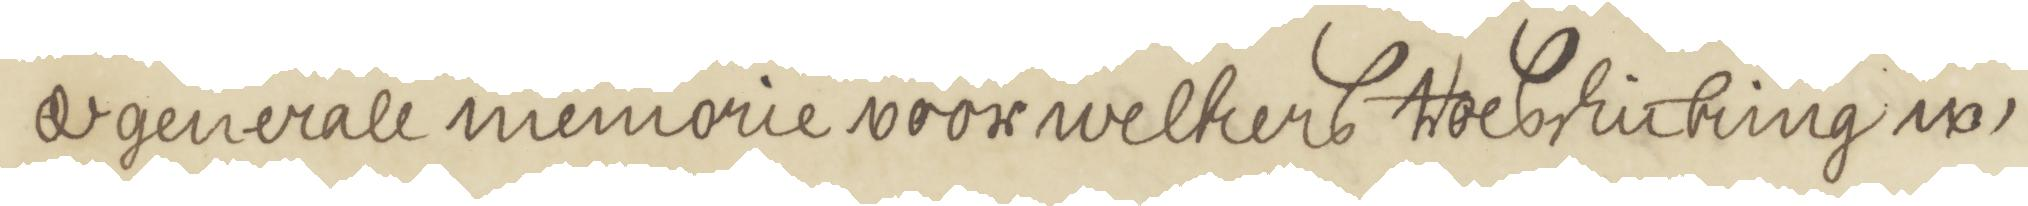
de generale memorie voor welkers toeschicking w'
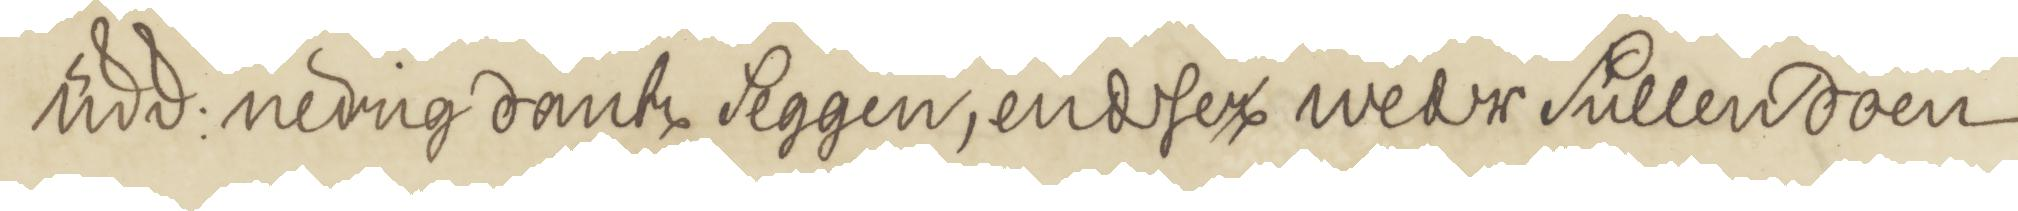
uEE: nedrig dank seggen, en deser weder sullen doen
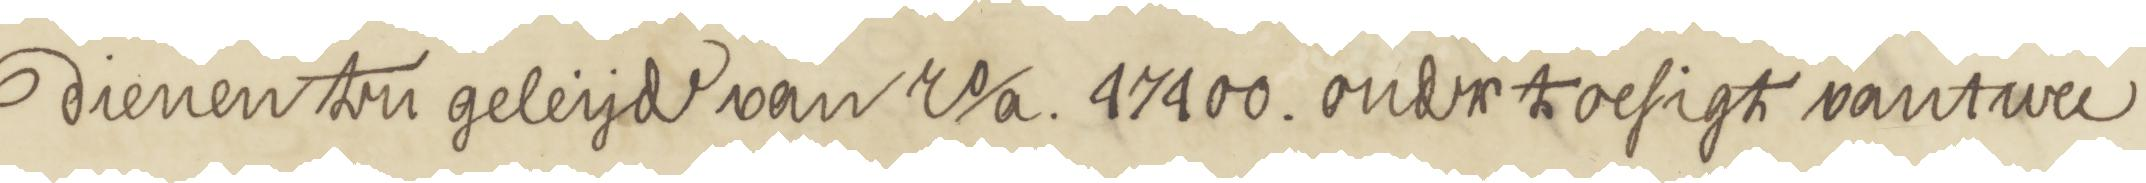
dienen ten geleijde van r/oa. 47400. onder toesigt van twee
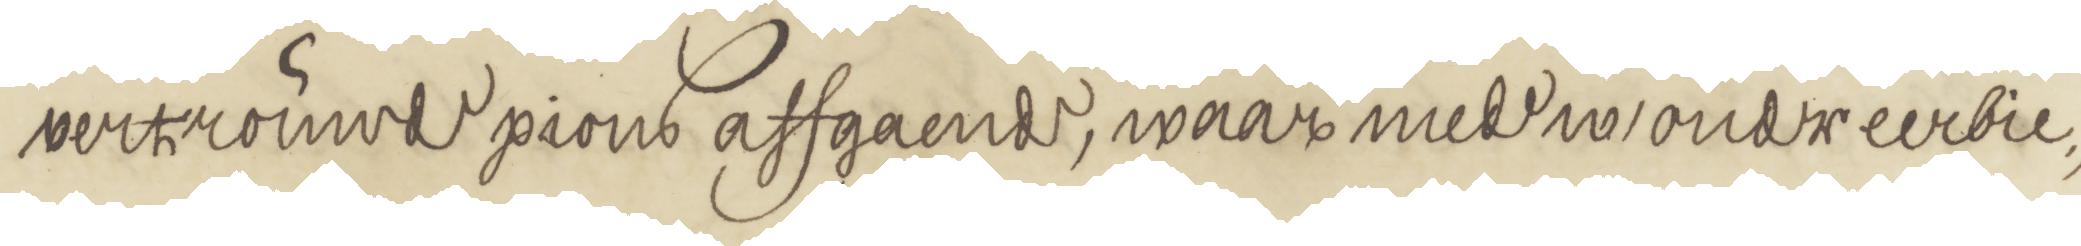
vertrouwde pions affgaende, waar mede w' onder eerbie
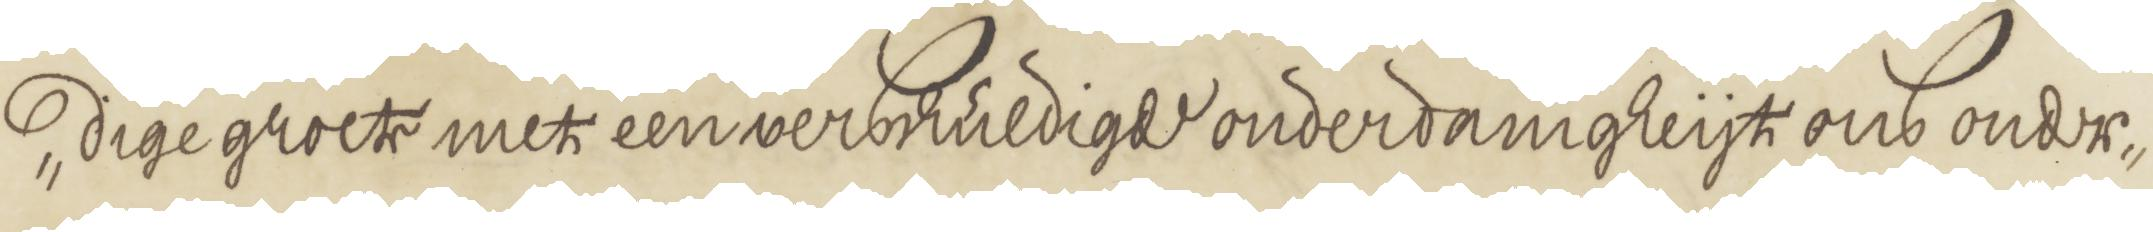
„dige groete met een verschuldigde onderdanigheijt ons onder„
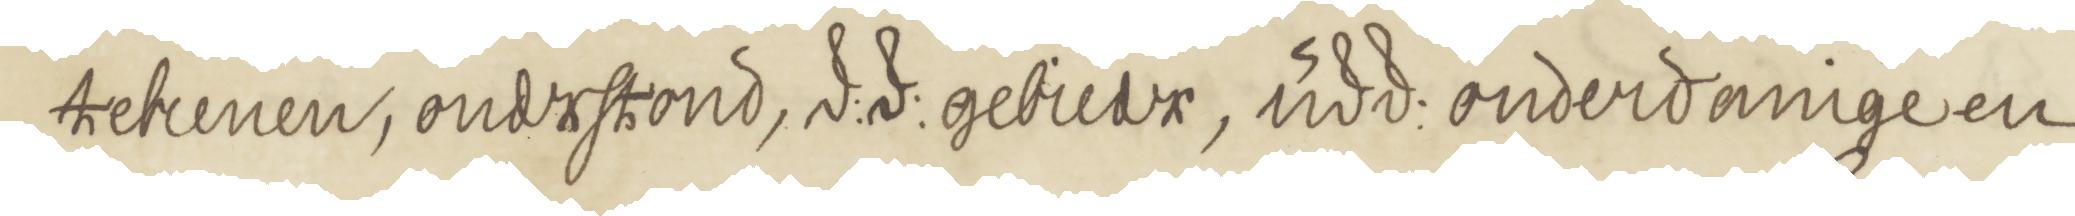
tekenen, onderstond, E:E: gebieder, uEE: onderdanige en
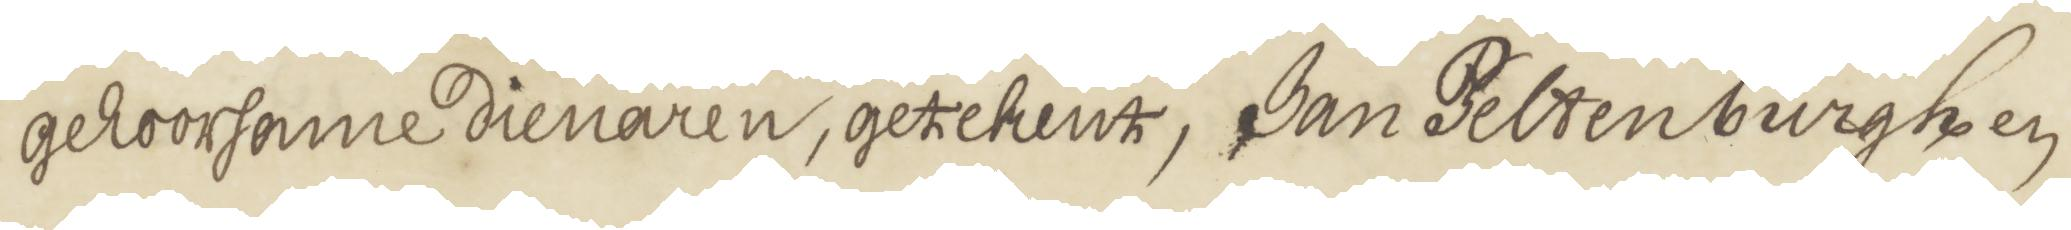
gehoorsame dienaren, getekent, Ian Peltenburgh en
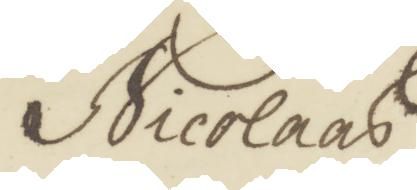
Nicolaas
